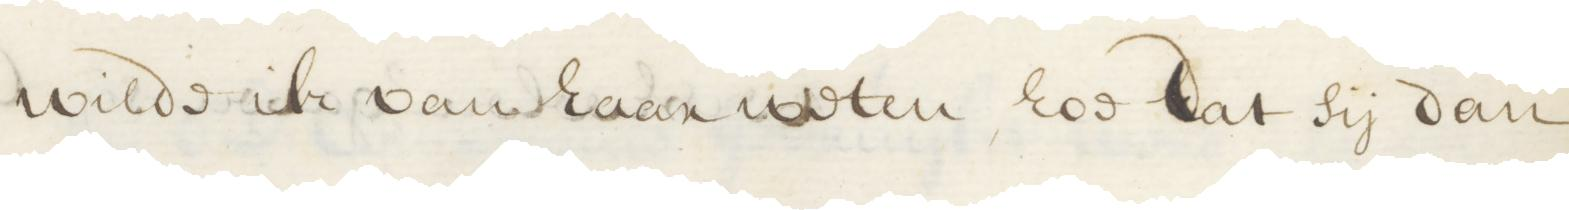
wilde ik van haar weten, hoe dat sij dan
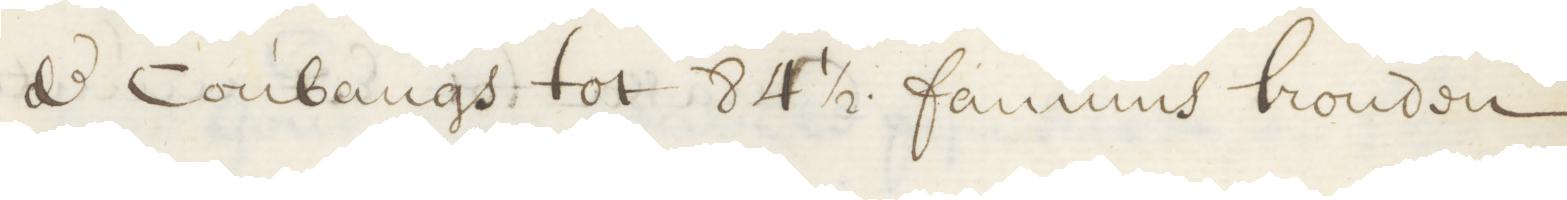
de Coubangs tot 84½. fanums konden
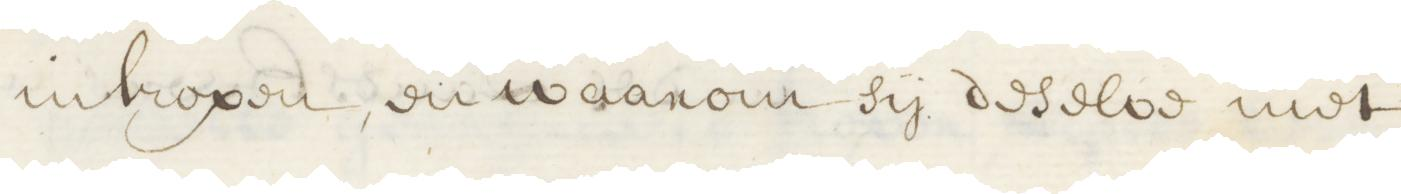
inkopen, en waarom sij deselve niet
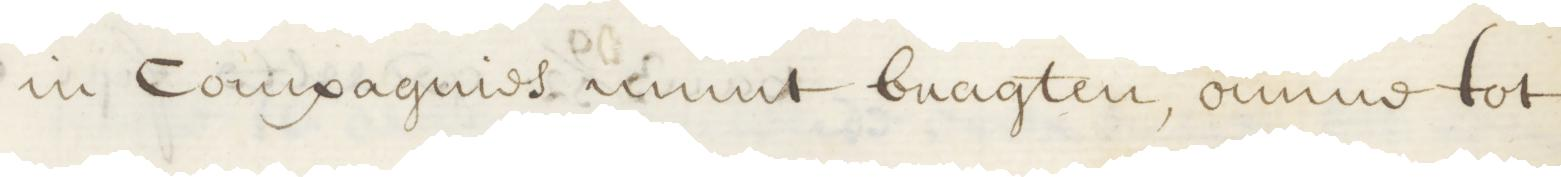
in Compagnies munt bragten, omme tot
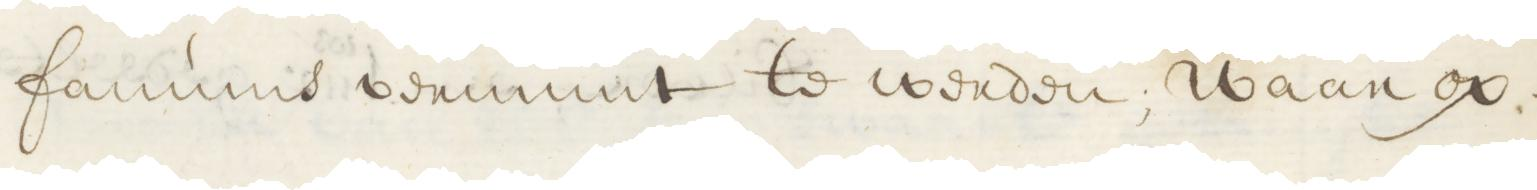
fanums vermunt te werden; waar op
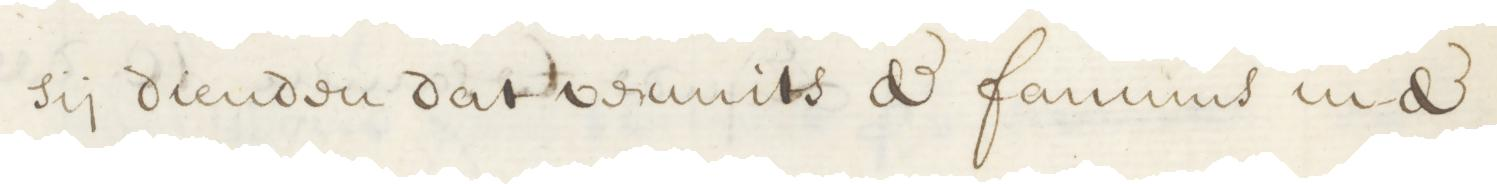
sij dienden dat vermits de fanums in de
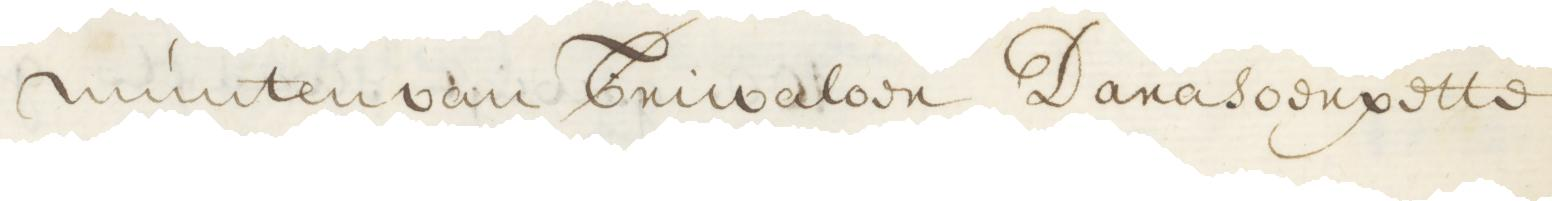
munten van Triwaloer, Darasoerpette
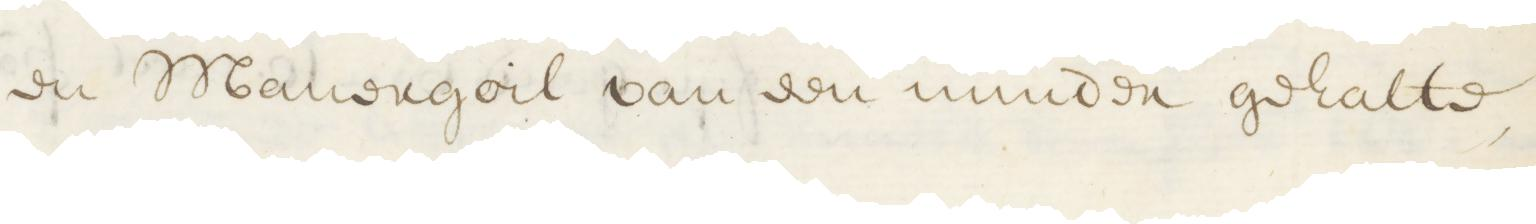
en Manergoil van een minder gehalte,
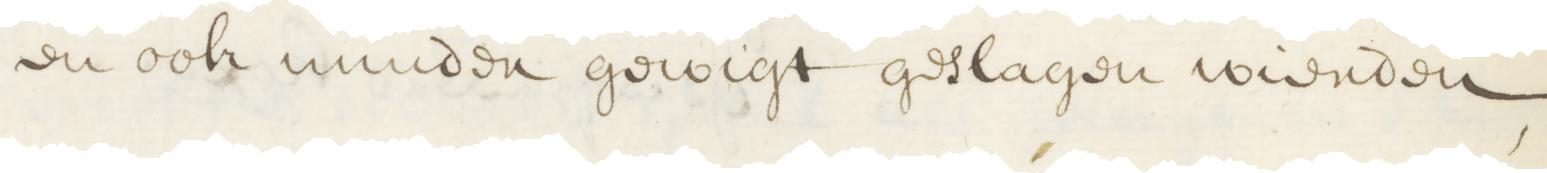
en ook minder gewigt geslagen wierden,
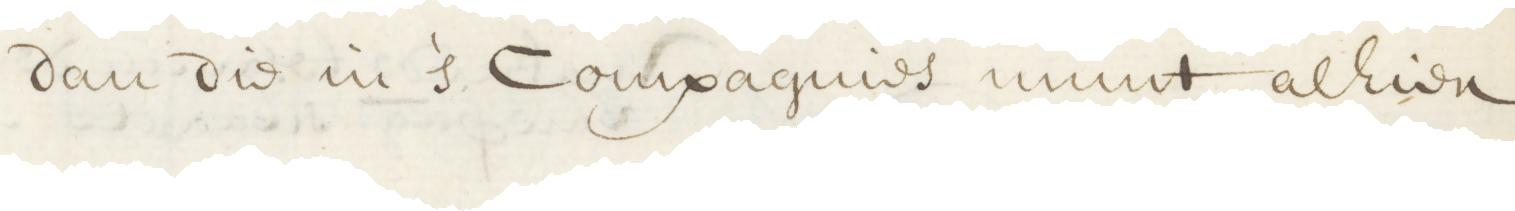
dan die in ’s Compagnies munt alhier
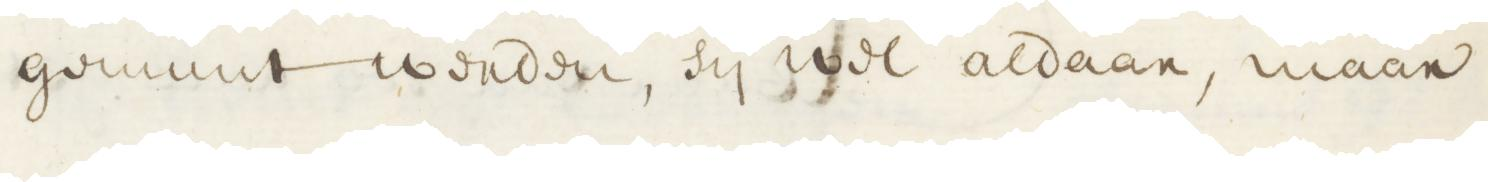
gemunt werden, sij wel aldaar, maar
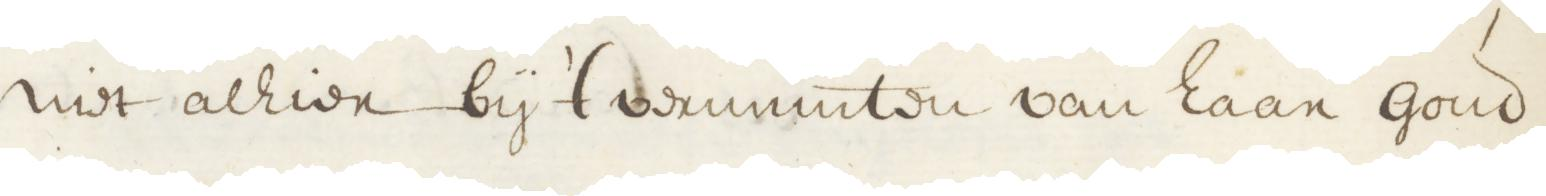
niet alhier bij ’t vermunten van haar goud
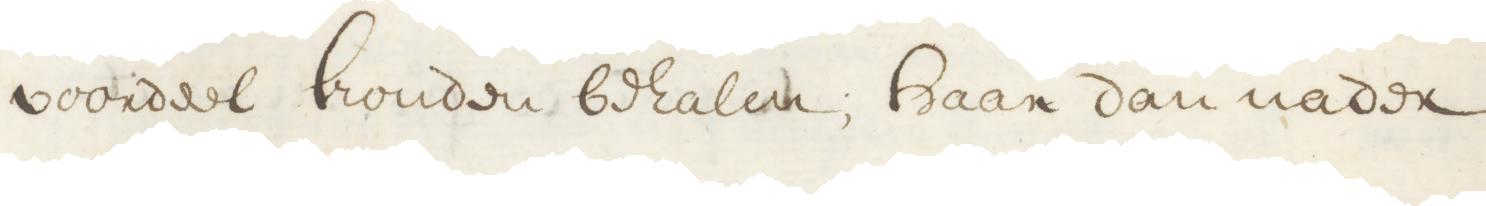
voordeel konden behalen; haar dan nader
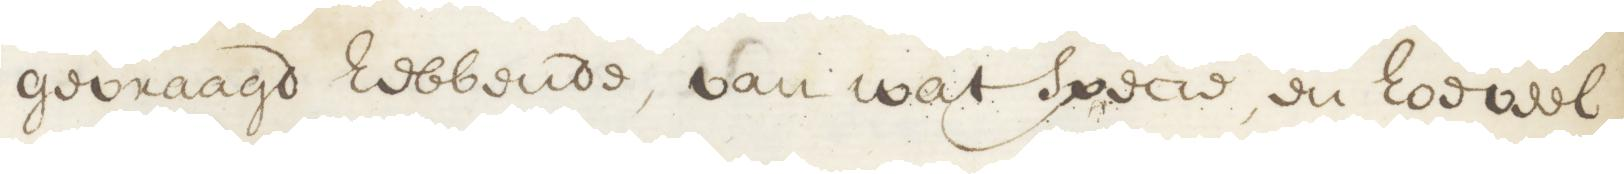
gevraagd hebbende, van wat specie, en hoeveel
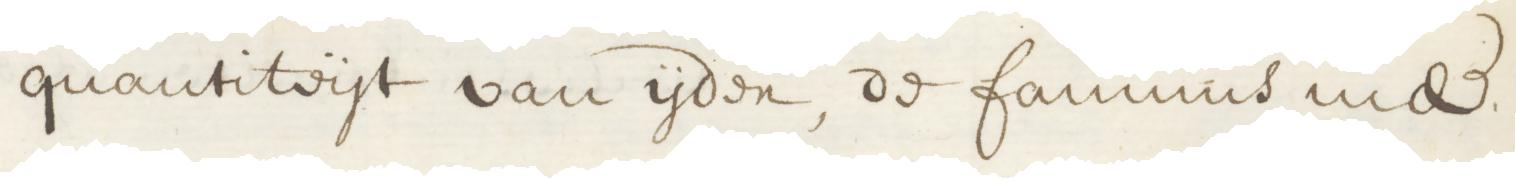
quantiteijt van ijder, de fanums inde
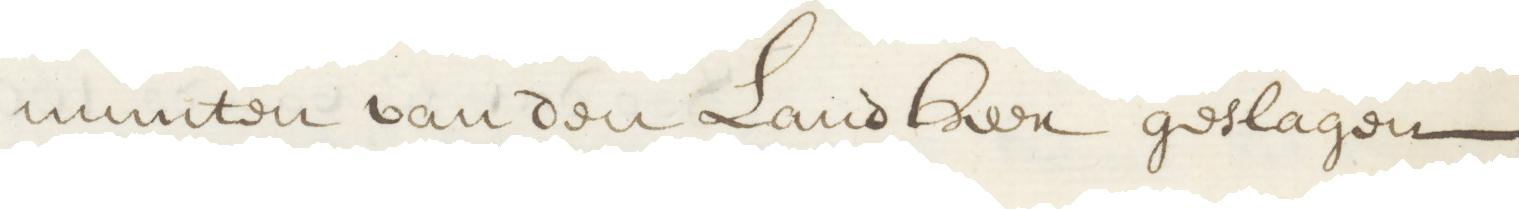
munten van den Land heer geslagen
